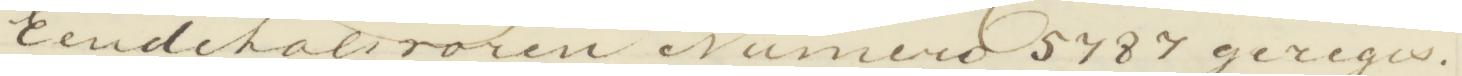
Een dit als voren Numero 5787 geregis.
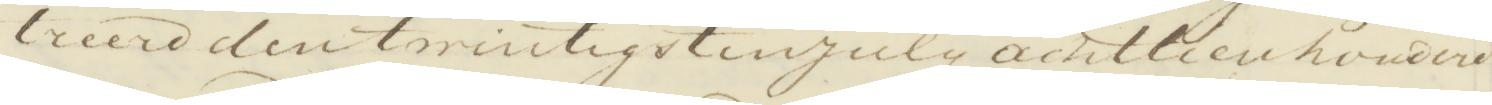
treerd den twintigsten July achttienhonderd
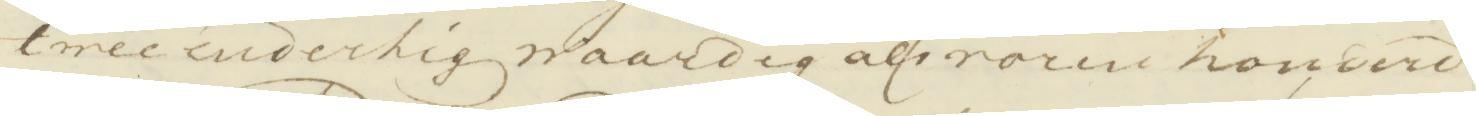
twee endertig waardig als voren honderd
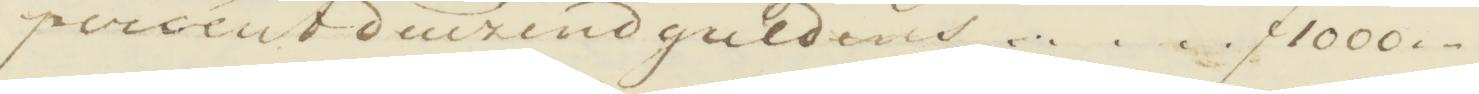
percent duizend guldens . . . . . . ƒ 1000. —
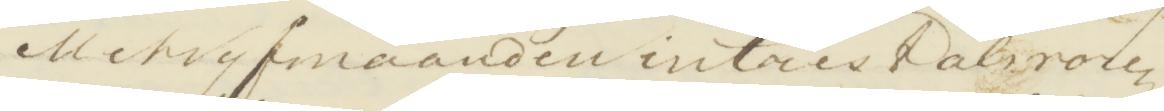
Met vyfmaanden intrest als voren
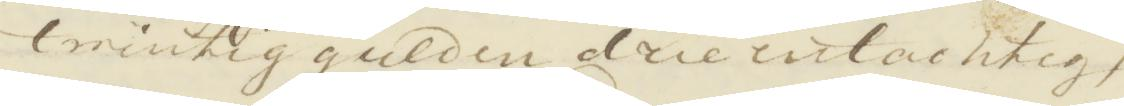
twintig gulden drie entachtig
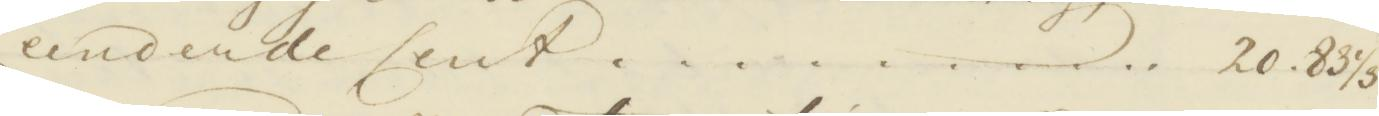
een derde Cent . . . . . . . . . . „ 20. 83 1/3
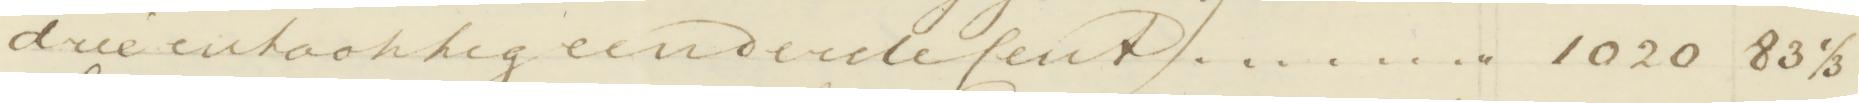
drie en tachtig eenderde Cent . . . . . . . „ 1020 83 1/3
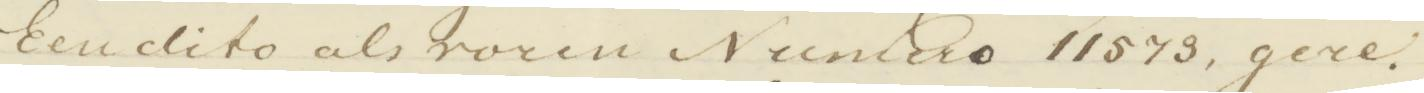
Een dito als voren Numero 11573, gere.
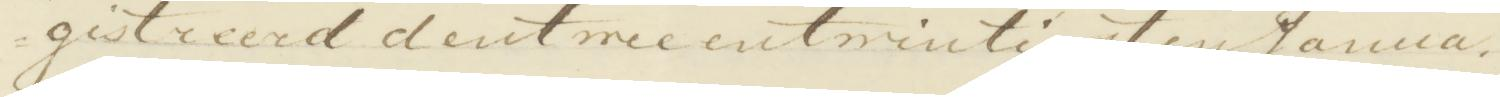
„gistreerd den twee entwintigsten Janua,
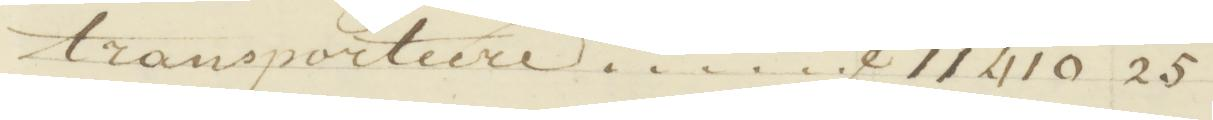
transporteere . . . . . . ƒ 11410 25
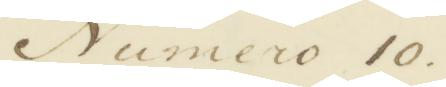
Numero 10.
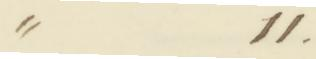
„ 11.
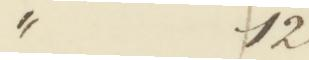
„ 12
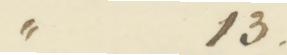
„ 13.
